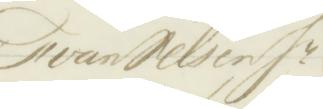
F van Velsen Jr
